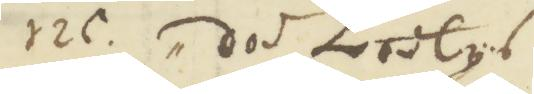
125. „ doe Zoelijs
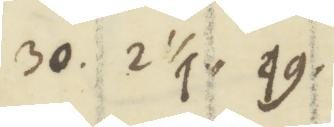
30. 2¼.„ 49
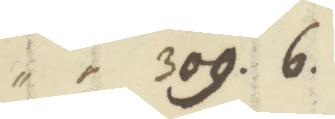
„ „ 309. 6.
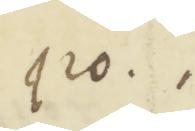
420.
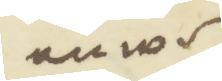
ruwe
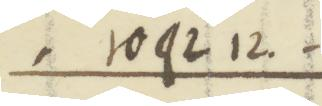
„ 1042 12.
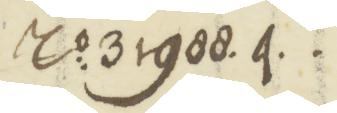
r:o 31988. 4. .
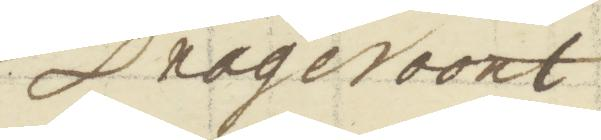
Dragevoort
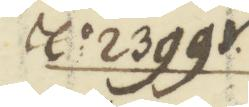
r:o 23991
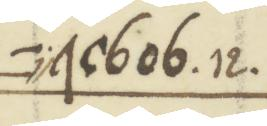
–„45686.12
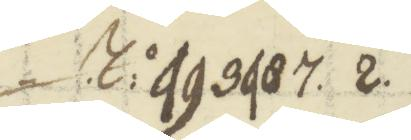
r:o 493487. 2.
